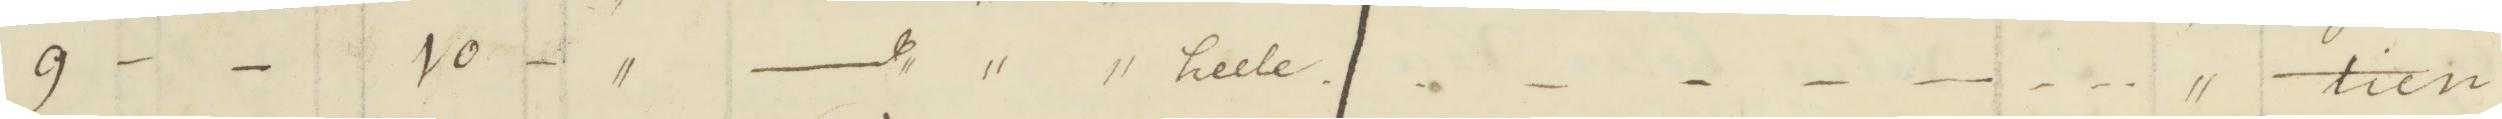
9 - — 10 - „ _„o „ „ heele- - - - - - - - „ tien
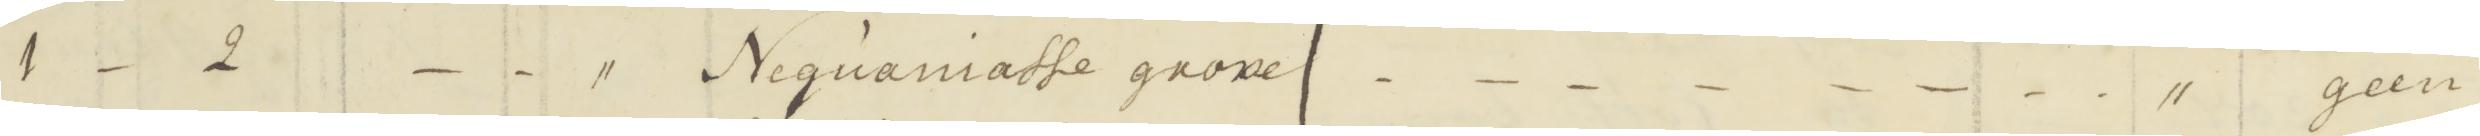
1 - 2 — - „ Nequaniasse grove - - - - - - - - „ geen
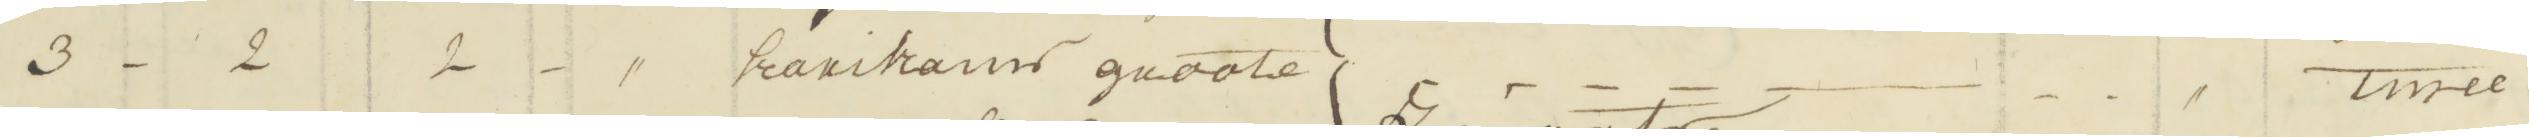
3 - 2 2 - „ karikams groote - - - - - - - - - „ twee
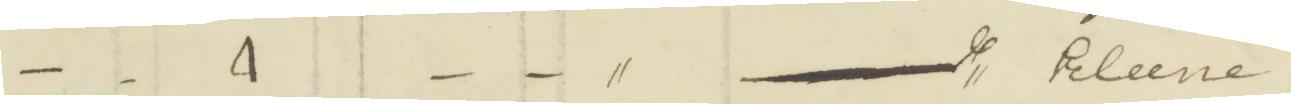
— - 4 — - „ _„o kleene
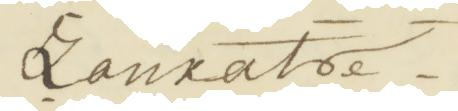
Zouratse -
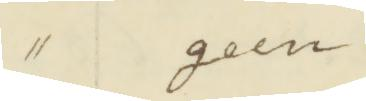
„ geen
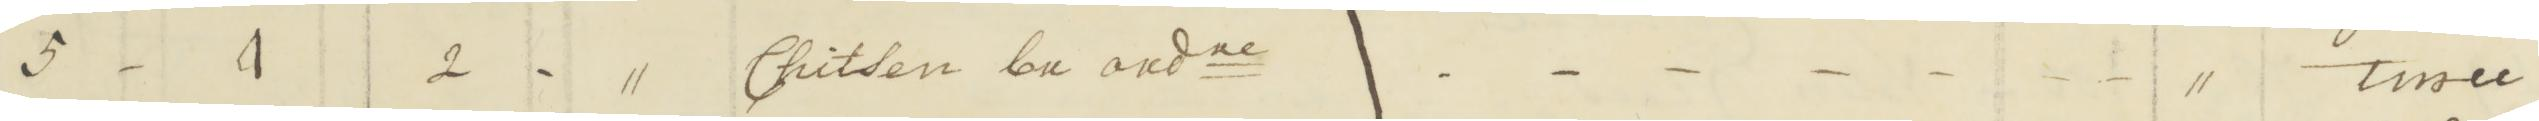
5 - 4 2 - „ Chitsen br ord=re - - - - - - - „ twee
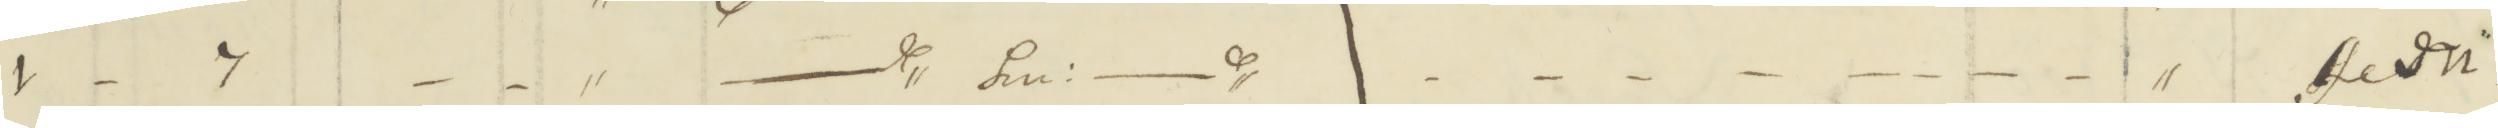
1 - 7 — - „ _„o sm: _„o - - - - - - - - „ geen
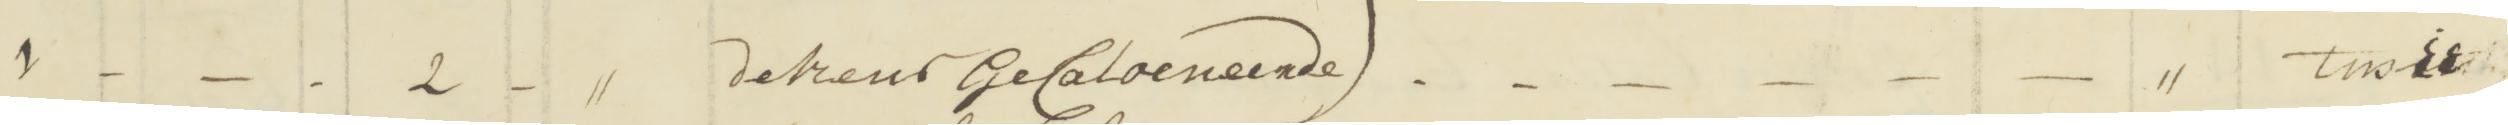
1 - — - 2 - „ dekens gecatoeneerde - - - - - - „ twee
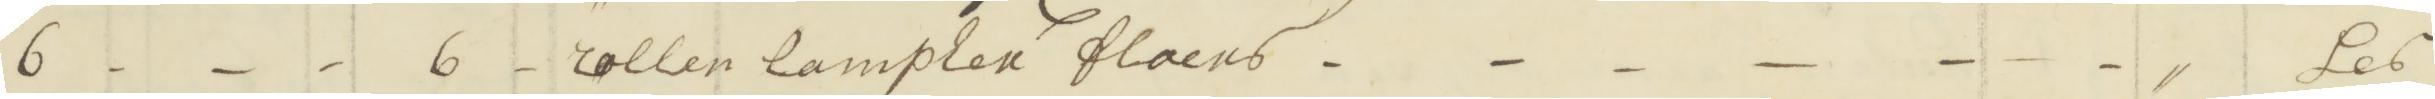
6 - — - 6 - rollen lampher floers - - - - - - - „ ses
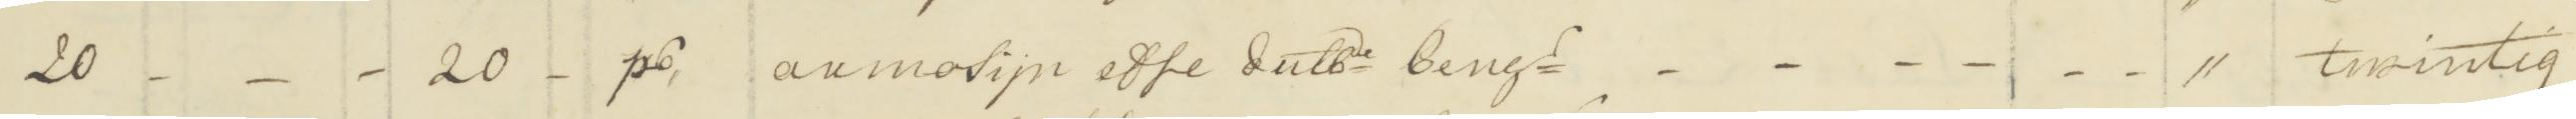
20 - — - 20 p„s armosijn effe dubb=de beng=s - - - - - - „ twintig
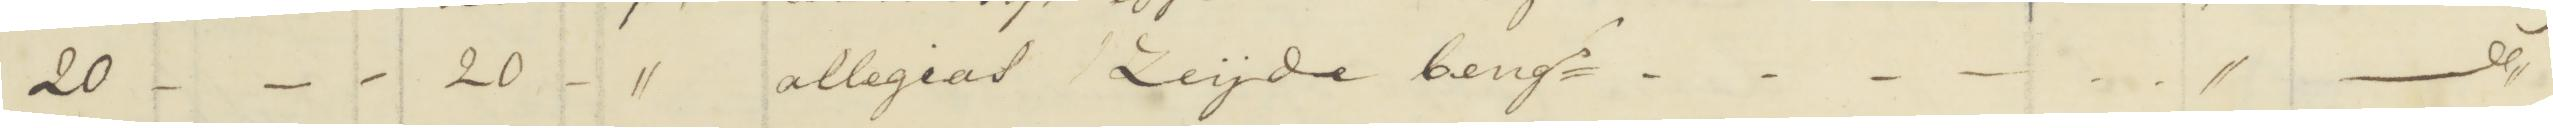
20 - — - 20 - „ allegias Zeijde beng=s - - - - - - „ _„o
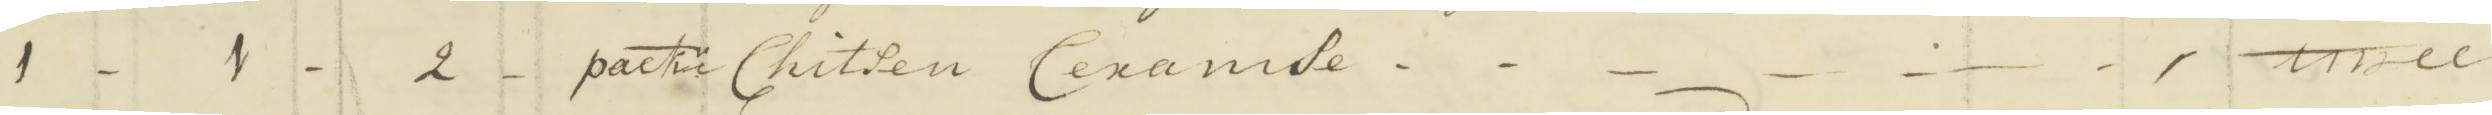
1 - 1 - 2 - packen chitsen ceramse - - - - - - - „ twee
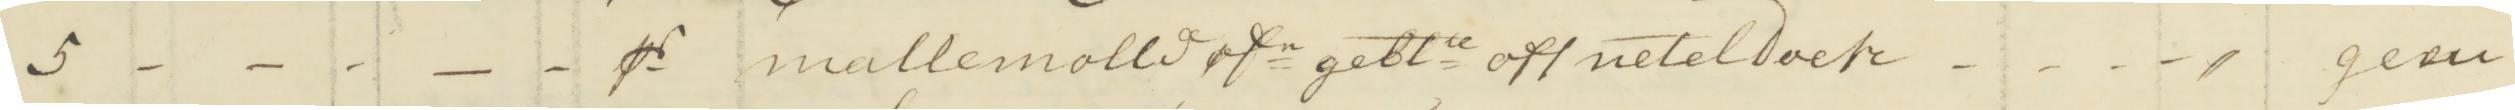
5 - — - — - p=s mallemolle of=r gebl=te off neteldoek - - - - „ geen
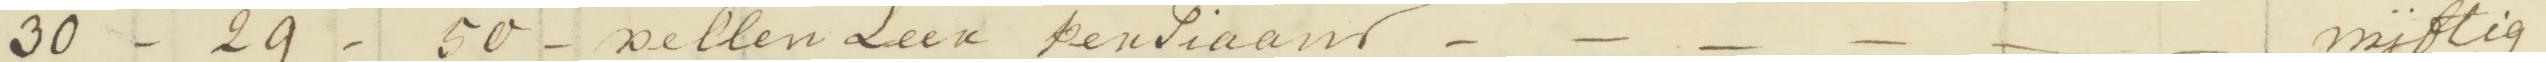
30 - 29 - 50 - vellen Leer persiaans - - - - - „ wijftig
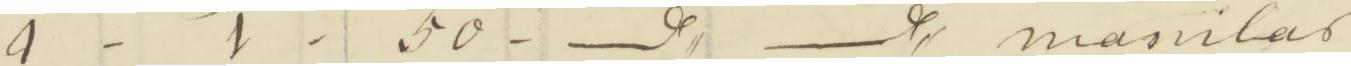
4 — 1 — 50 — _„o _„o manilas
